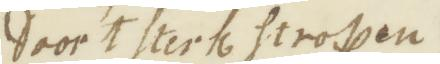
door ’t sterk stropen
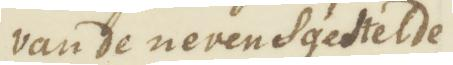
van de nevens gestelde
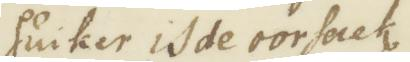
suiker is de oorsaek
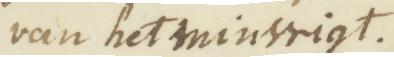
van het minwigt.
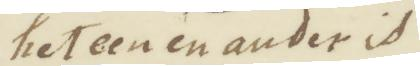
het een en ander is
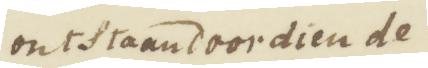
ontstaan door dien de
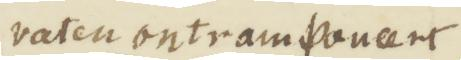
vaten ontramponeert
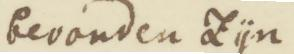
bevonden zijn
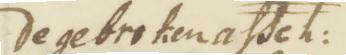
de gebroken afsch:
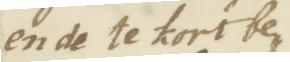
en de te kort be
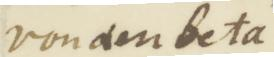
vonden beta
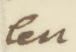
len
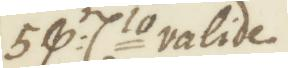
5 p:rC=to valide
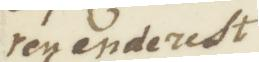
ren en de rest
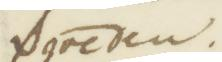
vergoeden.
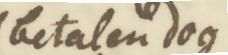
betalen dog
